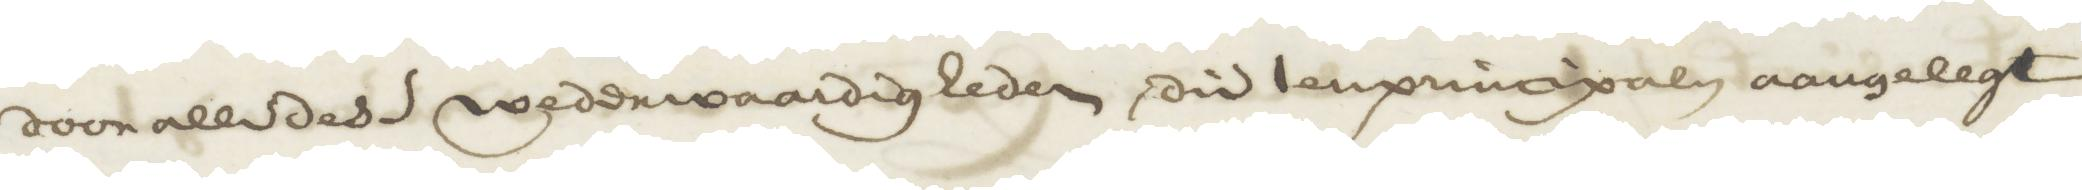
door alle dese wederwaardigheden, die ten principalen aangelegt
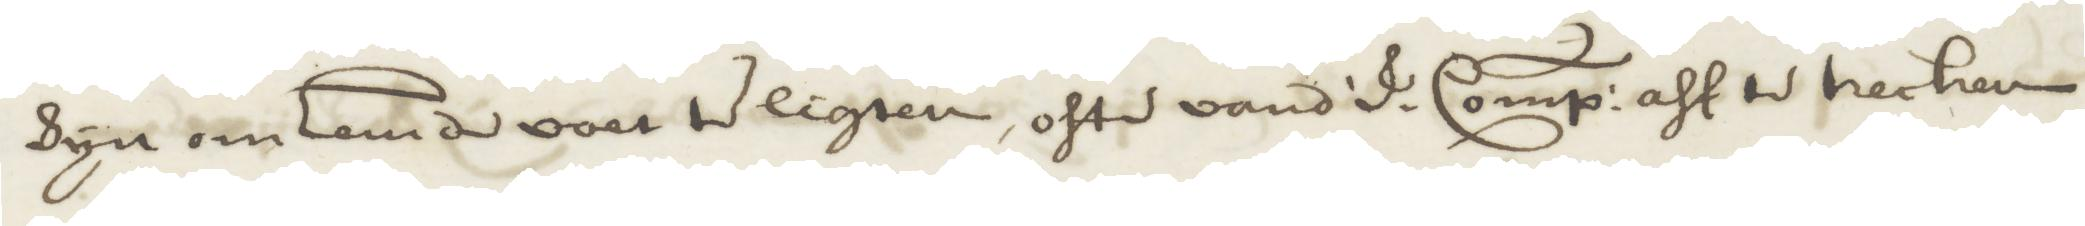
sijn om hem de voet te ligten, ofte vand 'E. Comp: aff te trecken
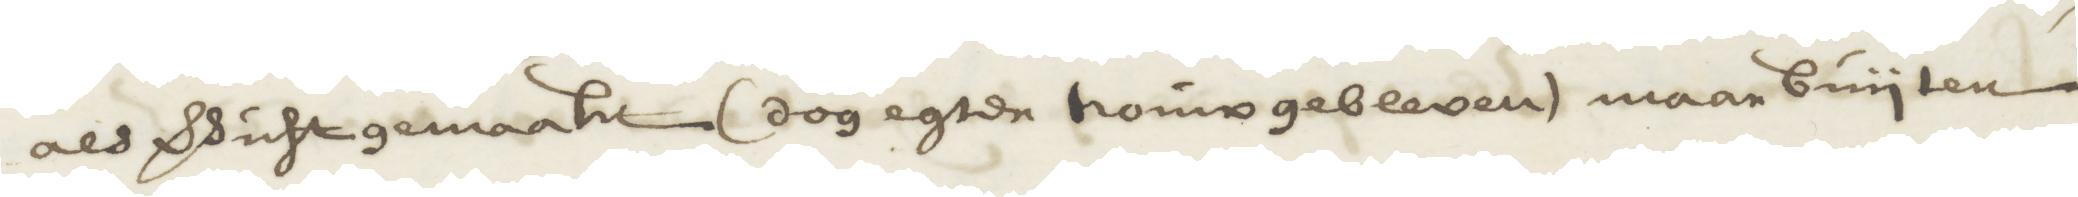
als versuft gemaakt (dog egter trouw gebleven) maar buijten
